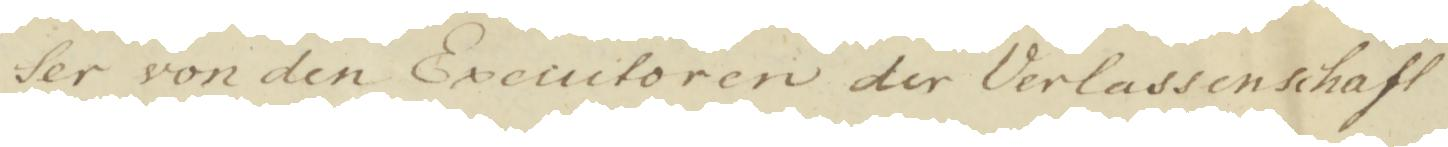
=ser von den Executoren der Verlassenschaft
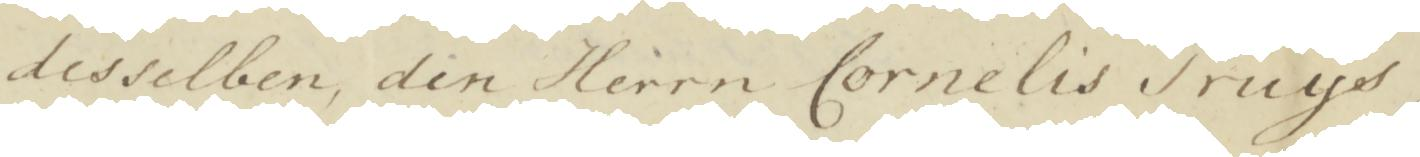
desselben, den Herrn Cornelis Pruijs
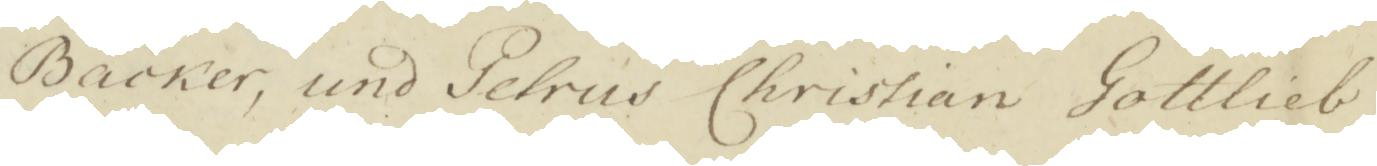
Bäcker, und Petrus Christian Gottlieb
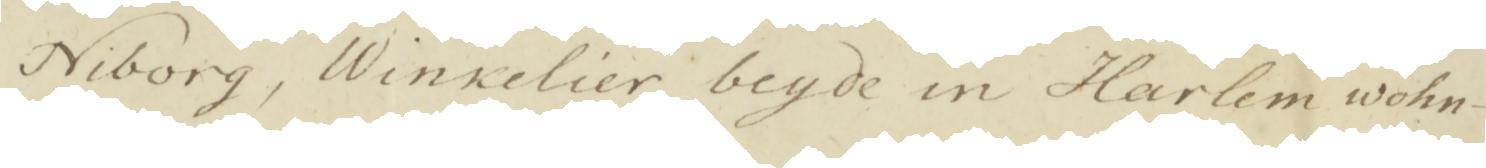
Niborg, Winkelier, beyde in Harlem wohn
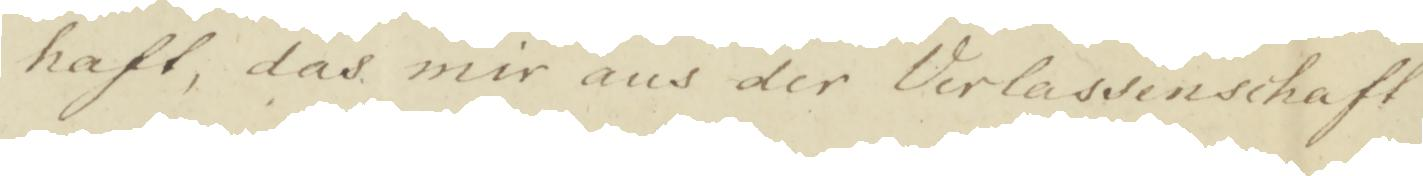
haft, das mir aus der Verlassenschaft
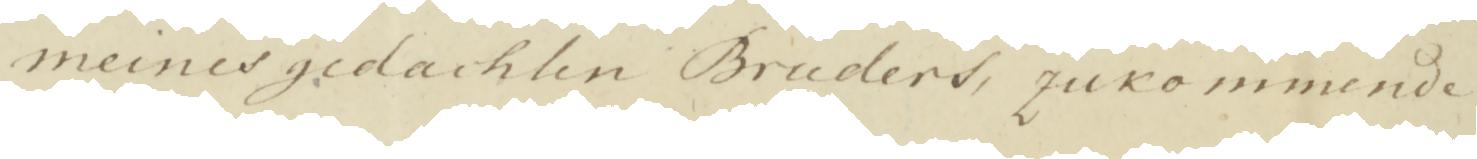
meines gedachten Bruders, zukommende
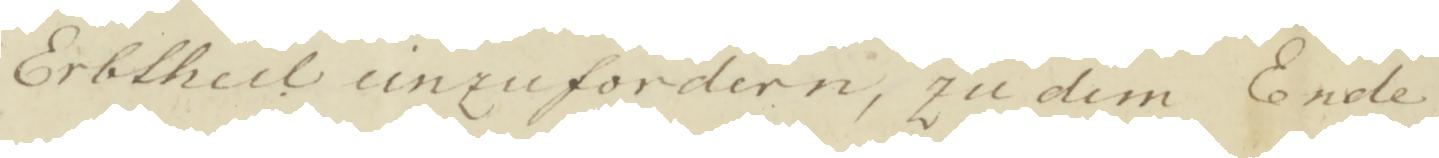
Erbtheil einzufordern, zu dem Ende
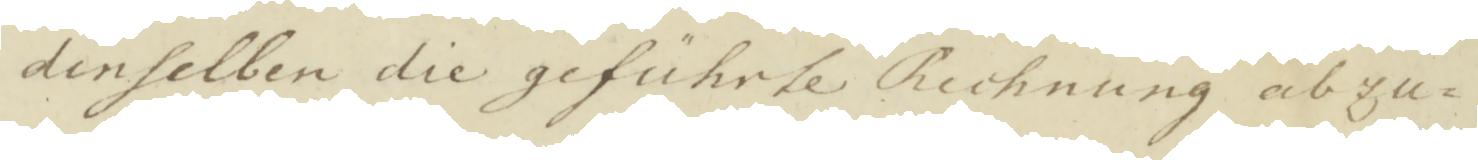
denselben die geführte Rechnung abzu=
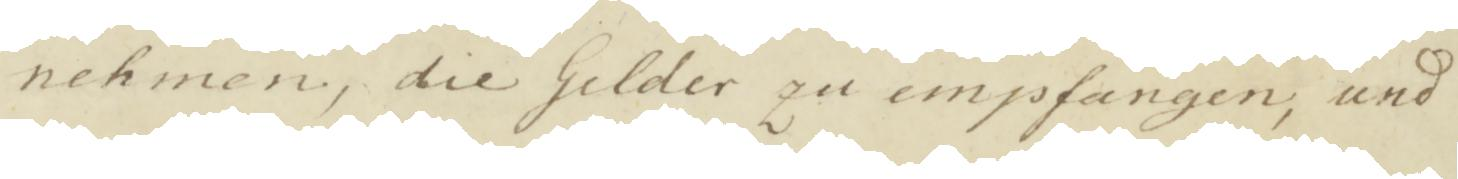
nehmen, die Gelder zu empfangen, und
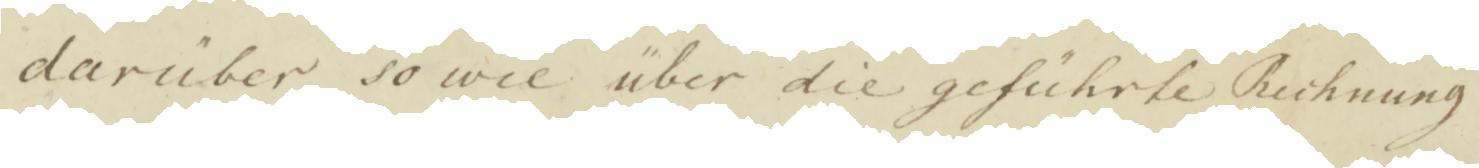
darüber, so wie über die geführte Rechnung
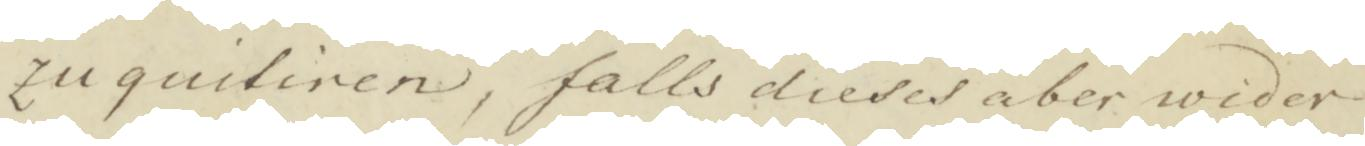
zu quitiren, falls dieses aber wider
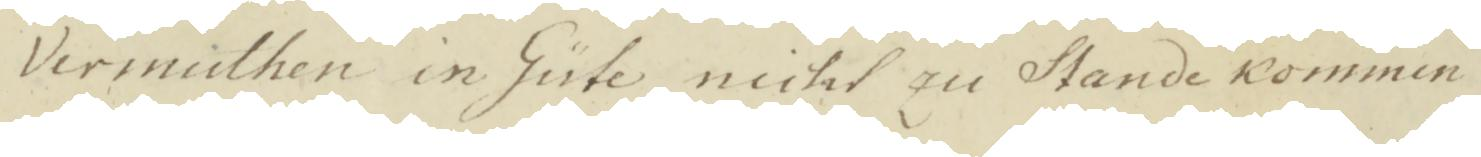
Vermuthen in Güte nicht zu stande kommen
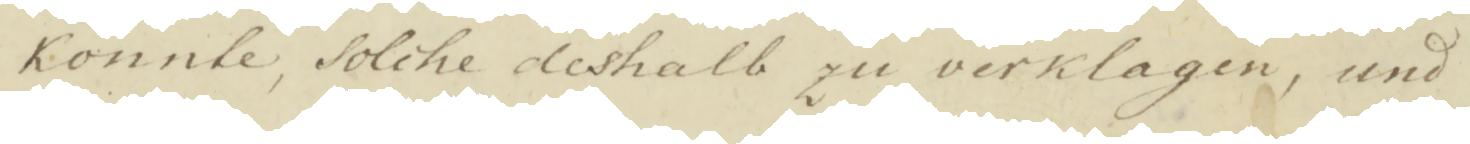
könnte, solche deshalb zu verklagen, und
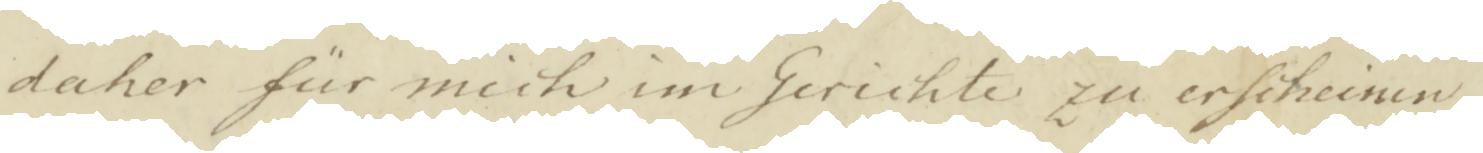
daher für mich im Gerichte zu erscheinen,
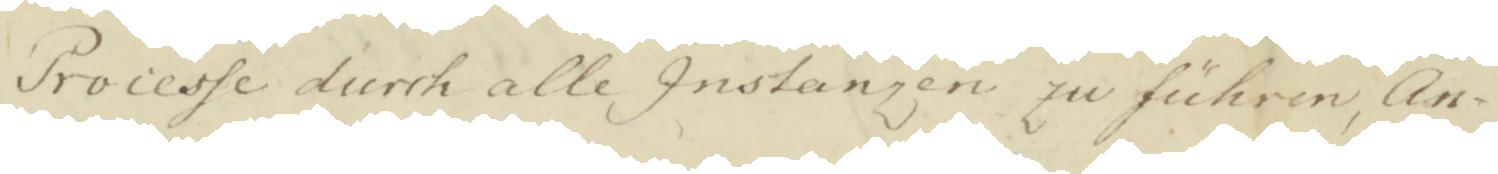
Processe durch alle Jnstanzen zu führen, An-
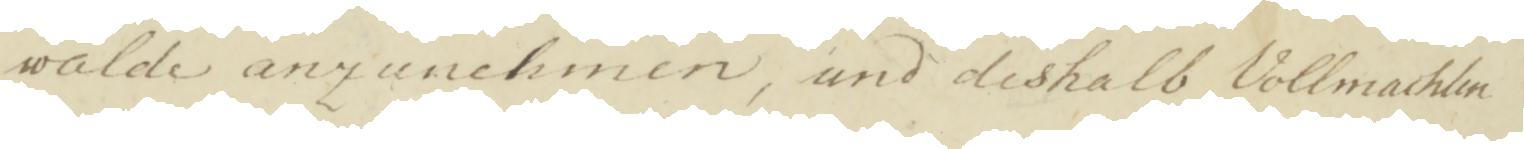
wälde anzunehmen, und deshalb Vollmachten
